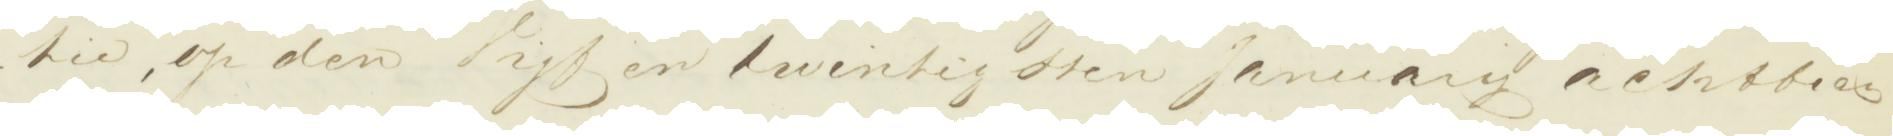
tie, op den Vijf en twintigsten Januarij achttien
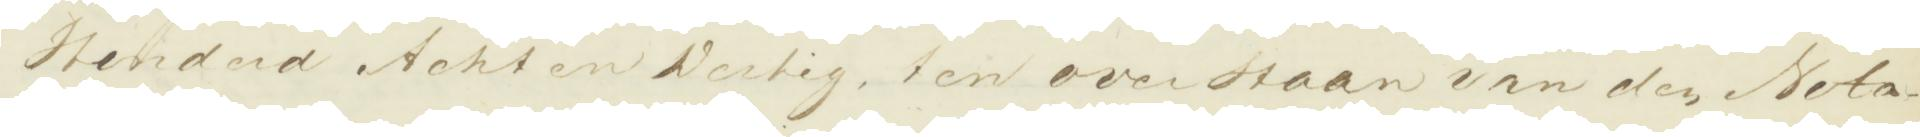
Honderd Acht en Dertig, ten overstaan van den Nota
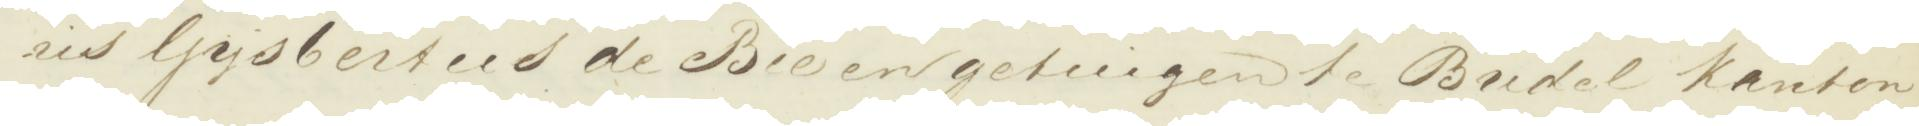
ris Gijsbertus de Bie en getuigen te Budel kanton
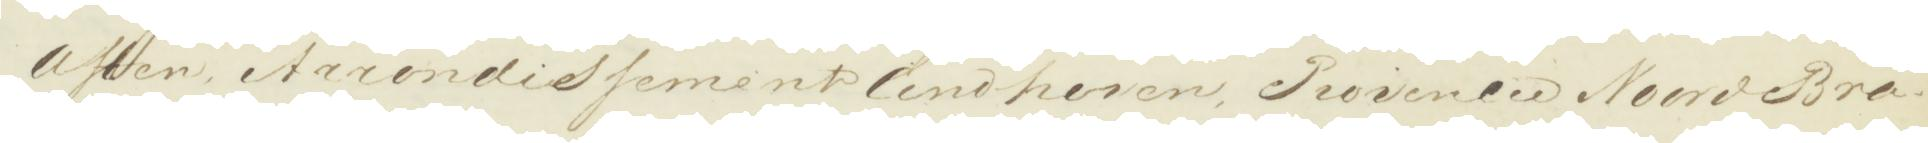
Asten, Arrondissement Eindhoven, Provencie Noord Bra
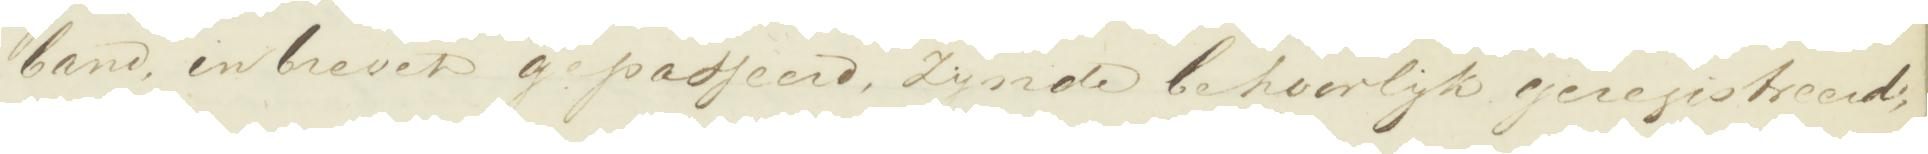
band, in brevet gepasseerd, zijnde behoorlijk geregistreerd:
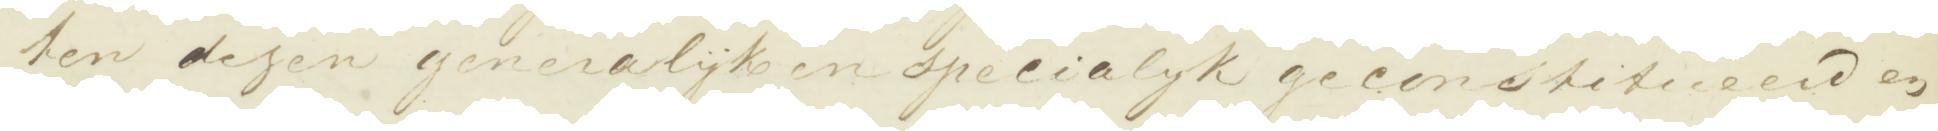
ten dezen generalijk en specialijk geconstitiueerd en
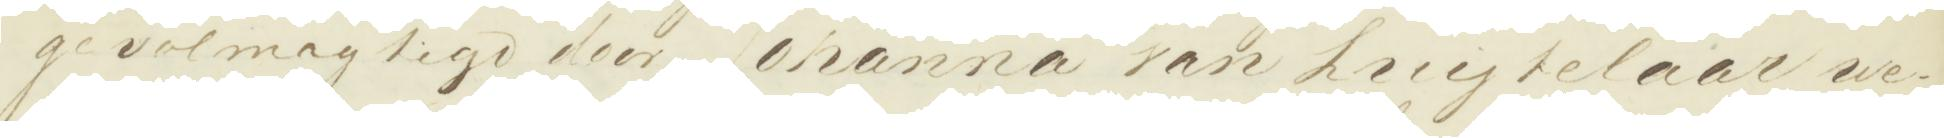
gevolmagtigd door Johanna van Luijtelaar we-
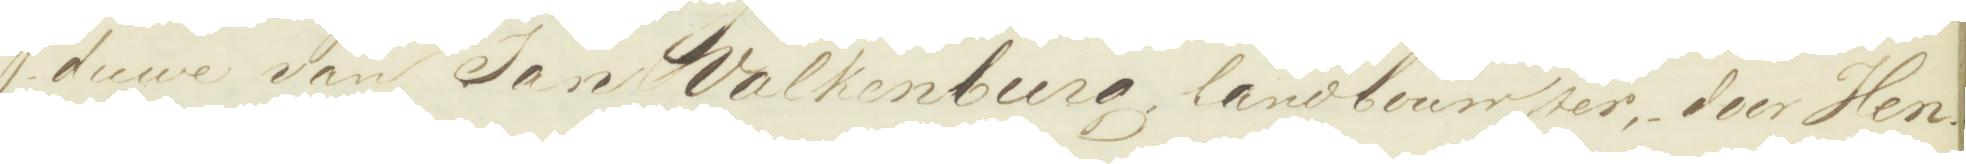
duwe van Jan Valkenburg, landbouwster, door Hen
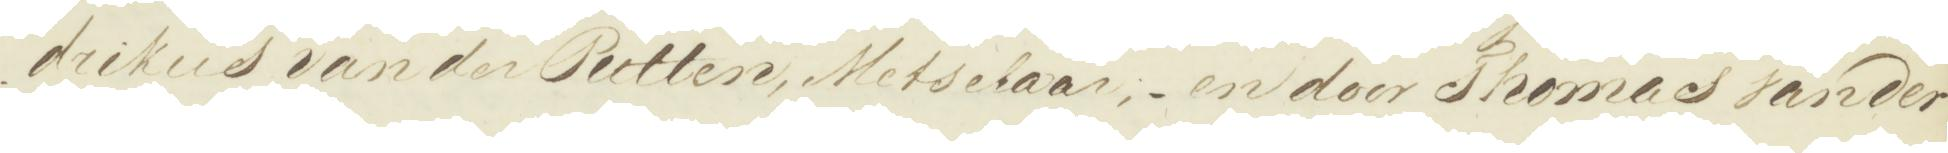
drikus van der Putten, Metselaar; - en door Thomas van der
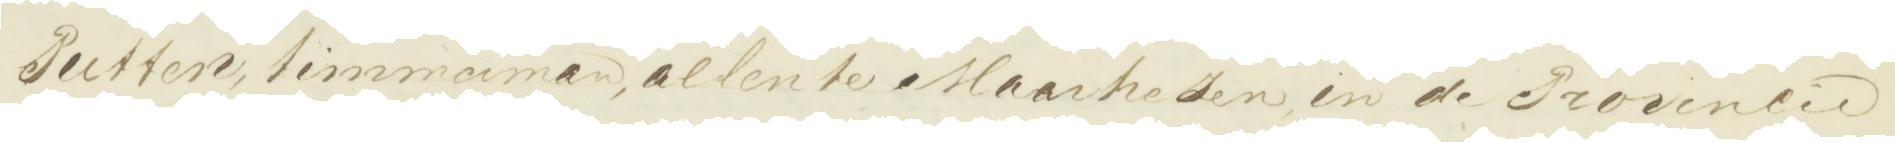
Putten, timmerman, allen te Maarhezen, in de Provincie
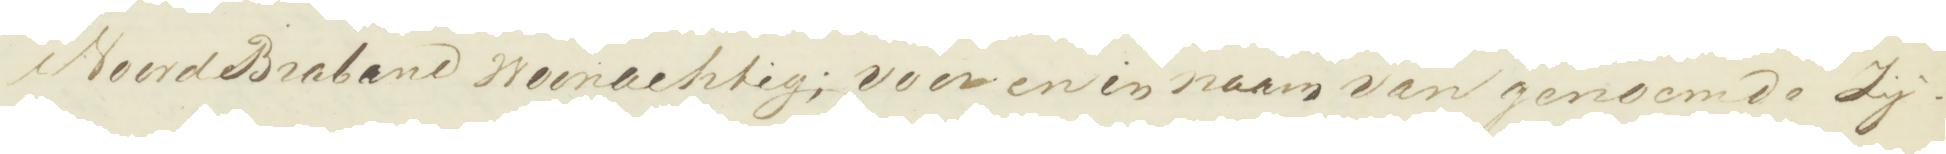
Noord Braband woonachtig; voor en in naam van genoemde zij
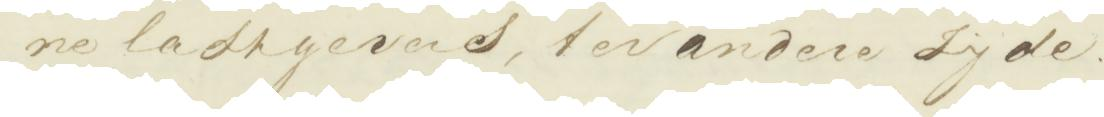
ne lastgevens, ter andere zijde
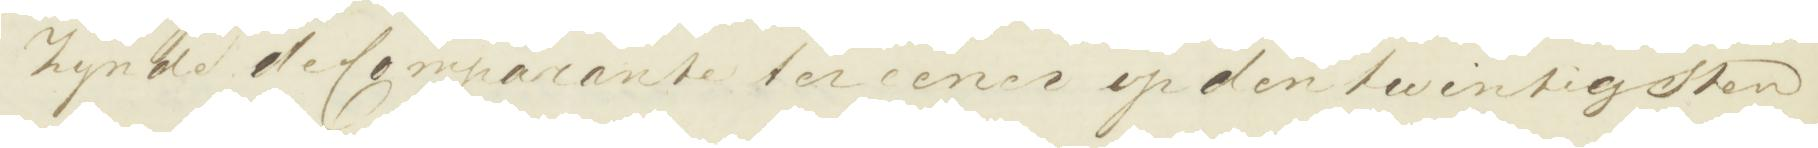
Zynde de Comparante ter eener op den twintigsten
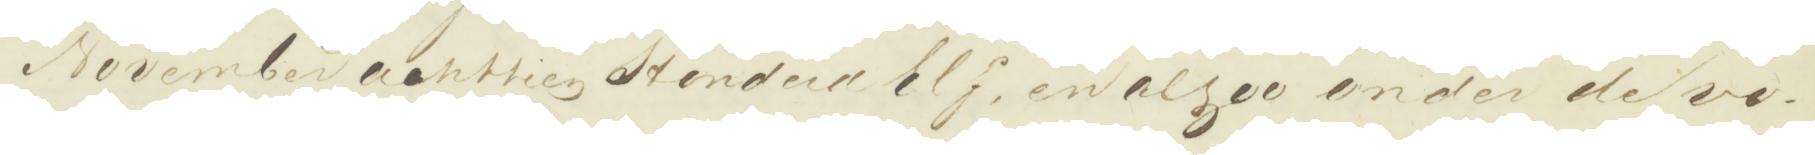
November achttien Honderd Elf, en alzoo onder de vo-
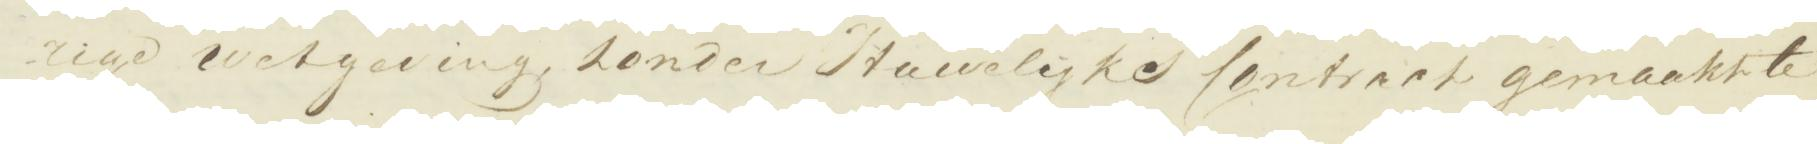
-rige wetgeving, zonder Huwelijks Contract gemaakt te
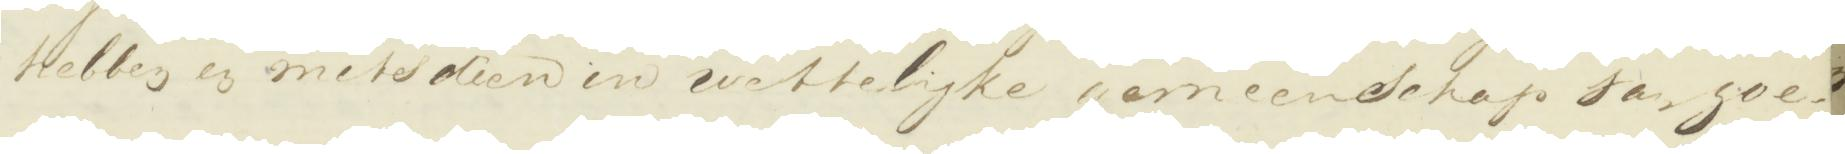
hebben en mitsdien in wettelijke gemeenschap van goe-
